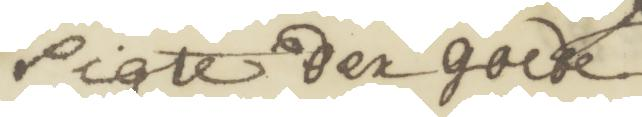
sigte der goede
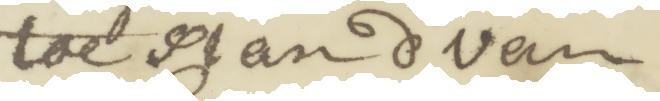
toe stand van
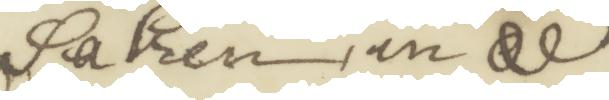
saken; in de
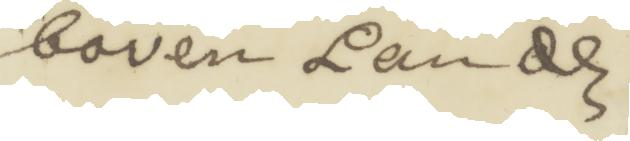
boven Landen
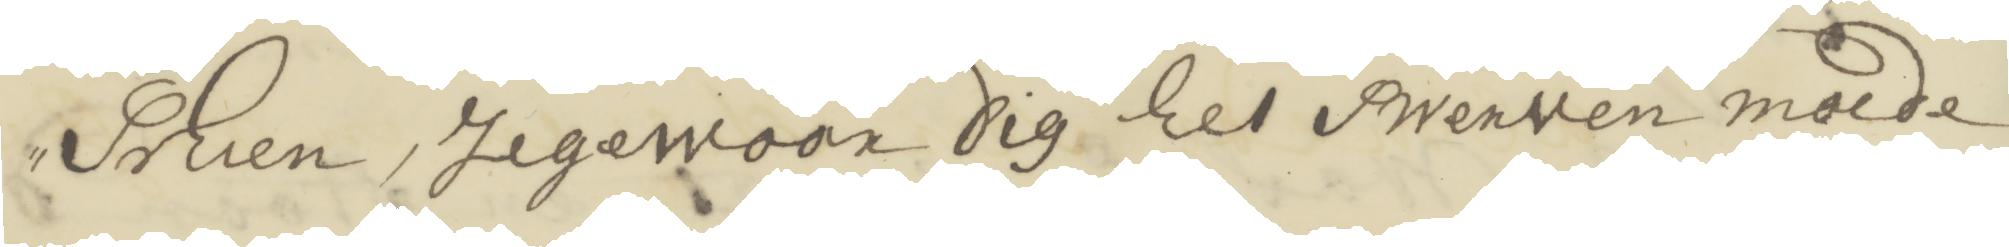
„schien, jegewoordig het swerven moede
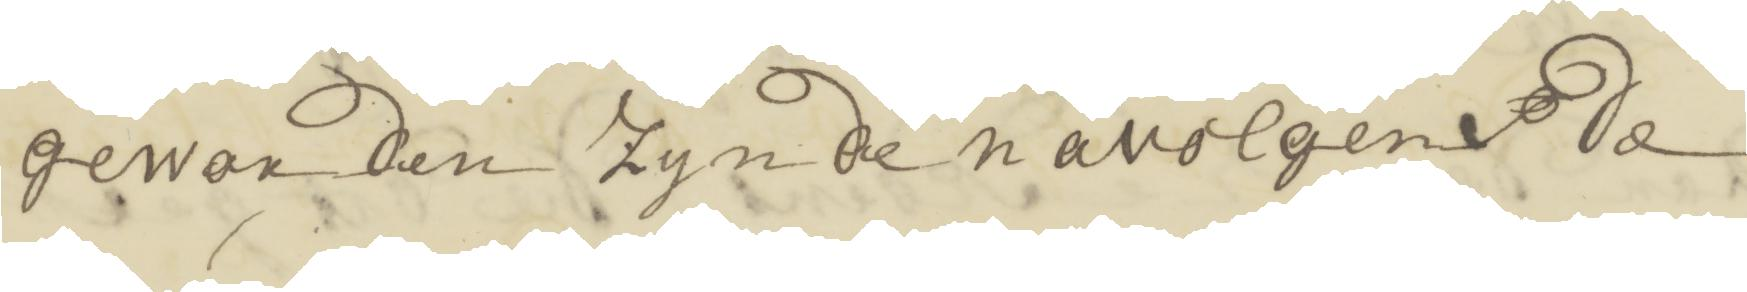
geworden zyn de navolgende
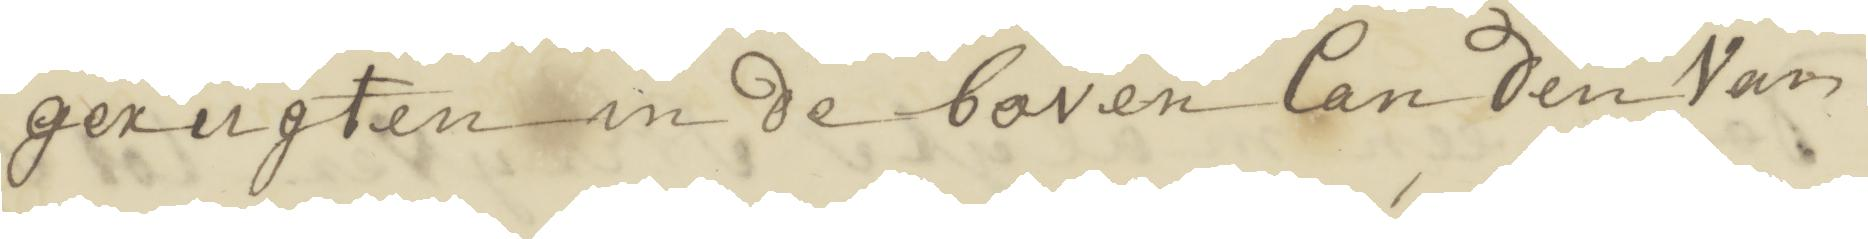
gerugten in de bovenlanden van
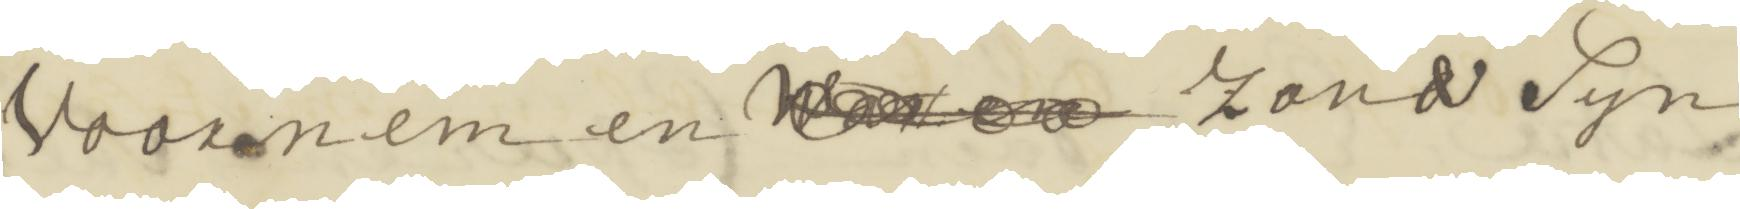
voornemen van voo zoude syn
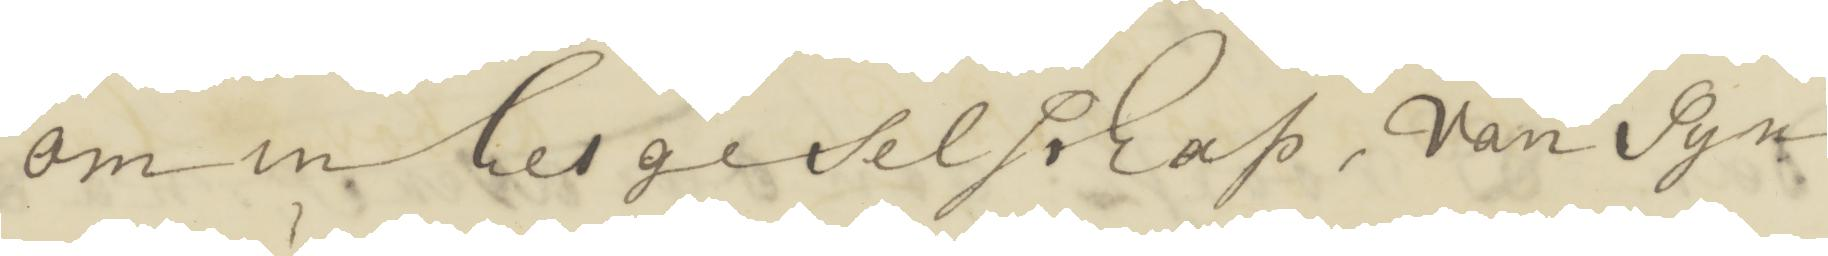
om in het geselschap, van syn
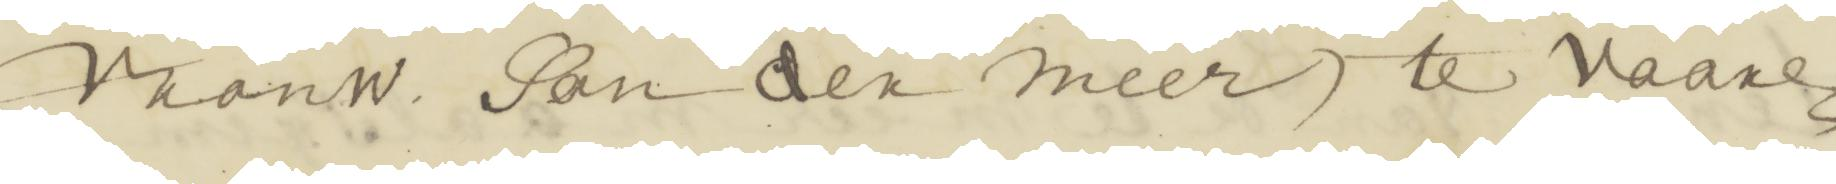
vrouw Jan der meer) te vaaren
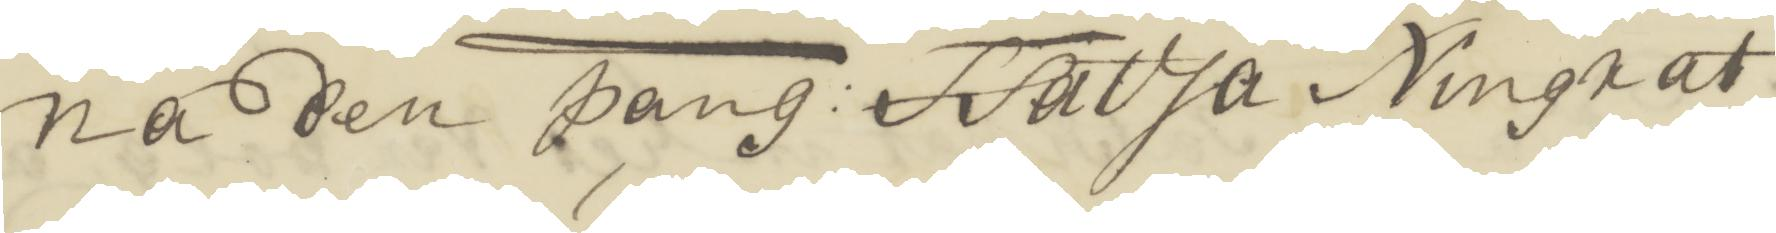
na den pang: Tsatja Ningrat
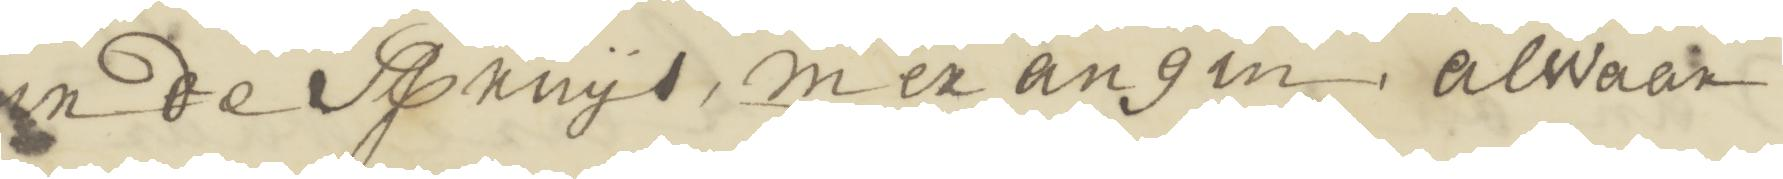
in de spruijt, mer angin, alwaar
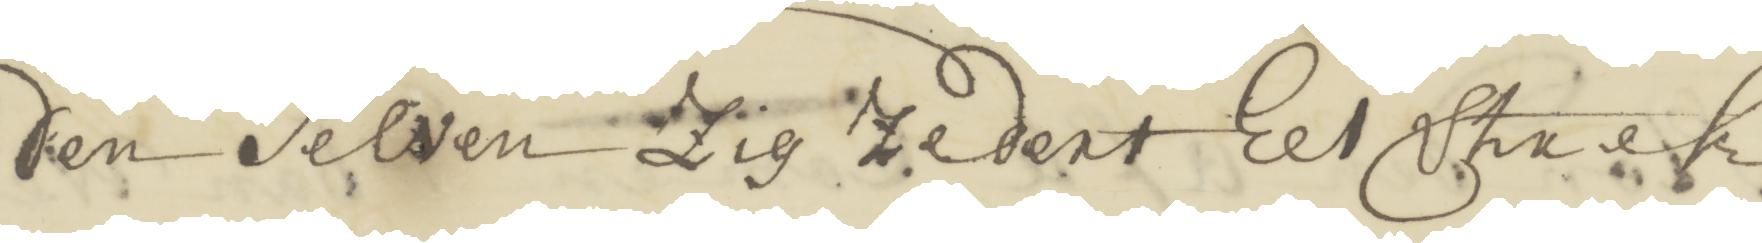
den selven zig zedert het vertrek
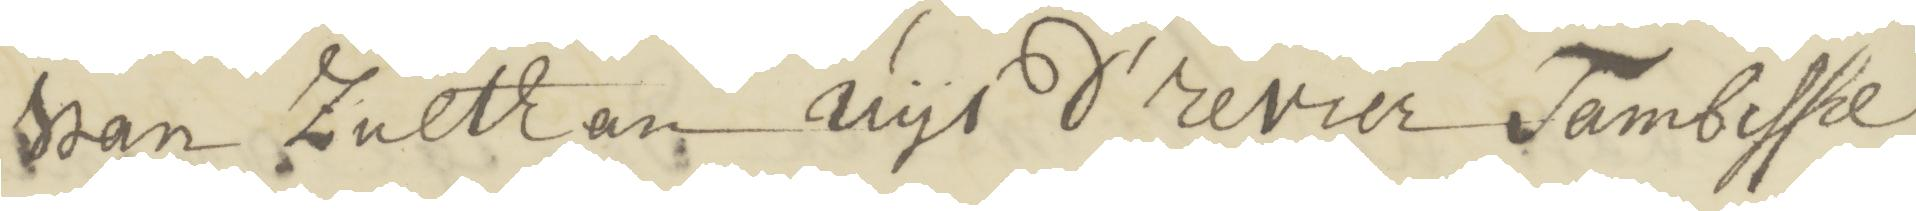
van zulthan uijt d’revier Tambisse
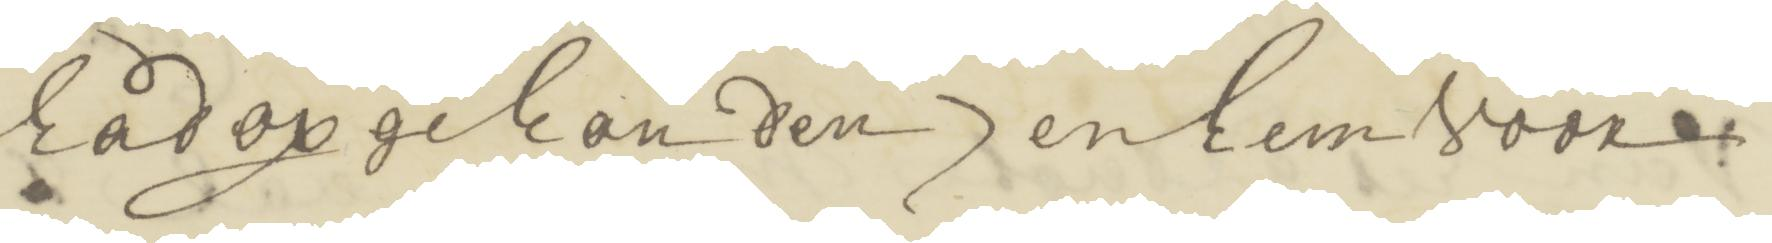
had op gehouden) en hem voor
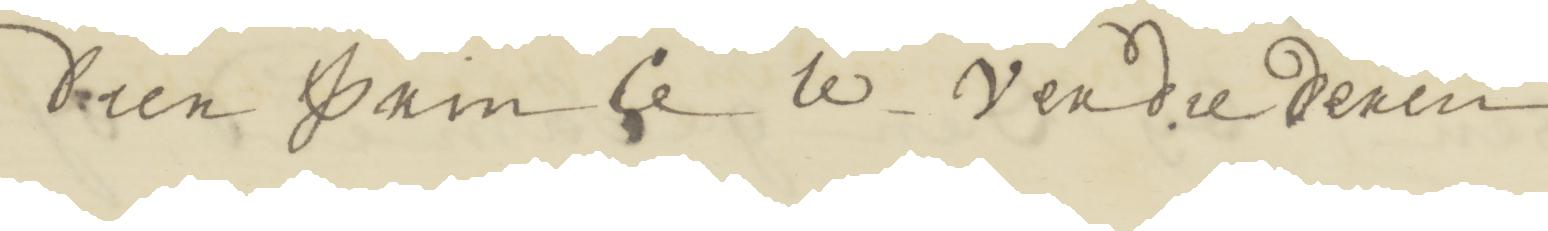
dien prince te verdiederen
